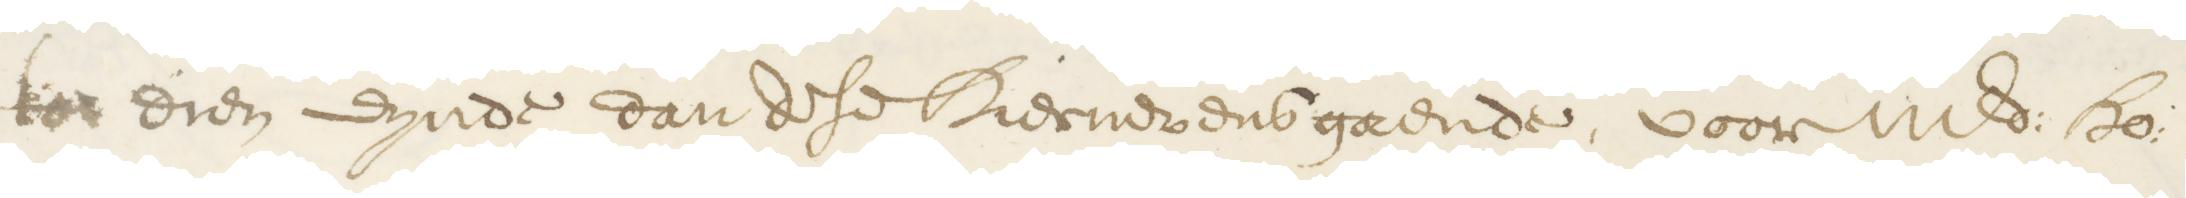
tot dien eijnde dan dese Hiernevens gaende, voor uEd: Ho:
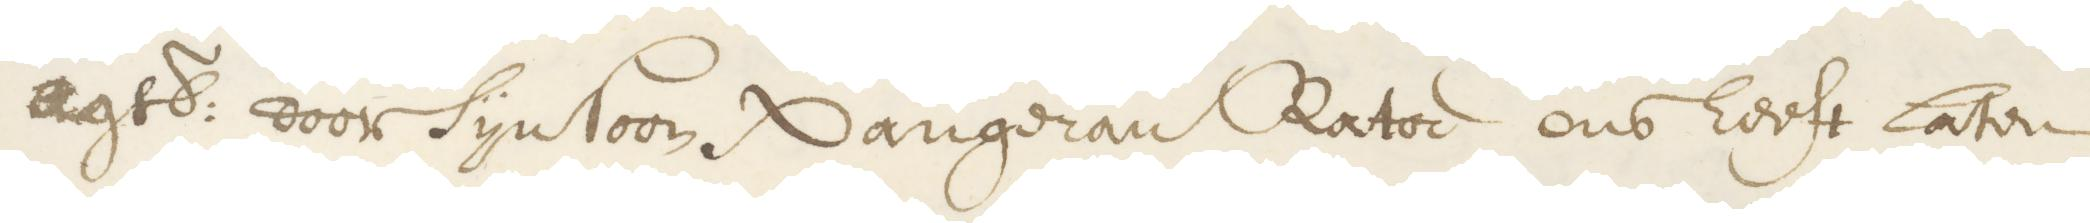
agtb: door sijn soon pangeran Ratoe ons heeft laten
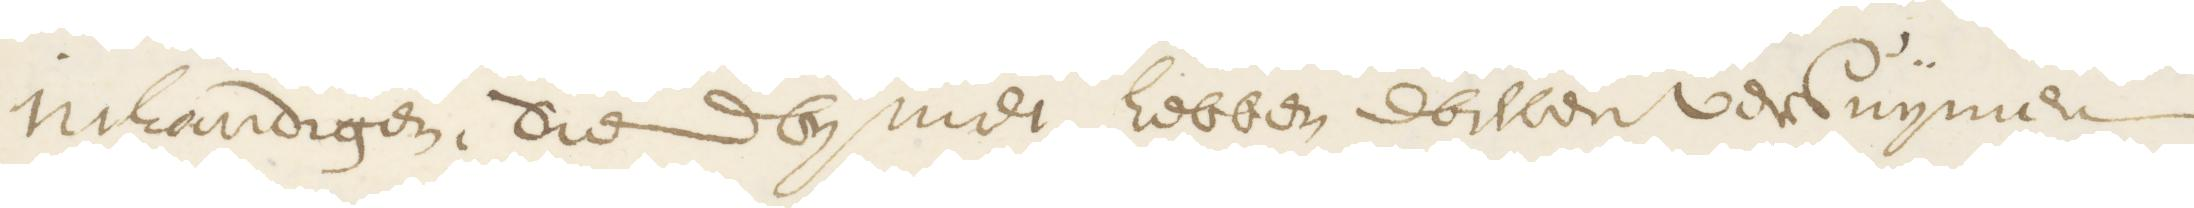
inhandigen, die wij niet hebben willen versuijmen
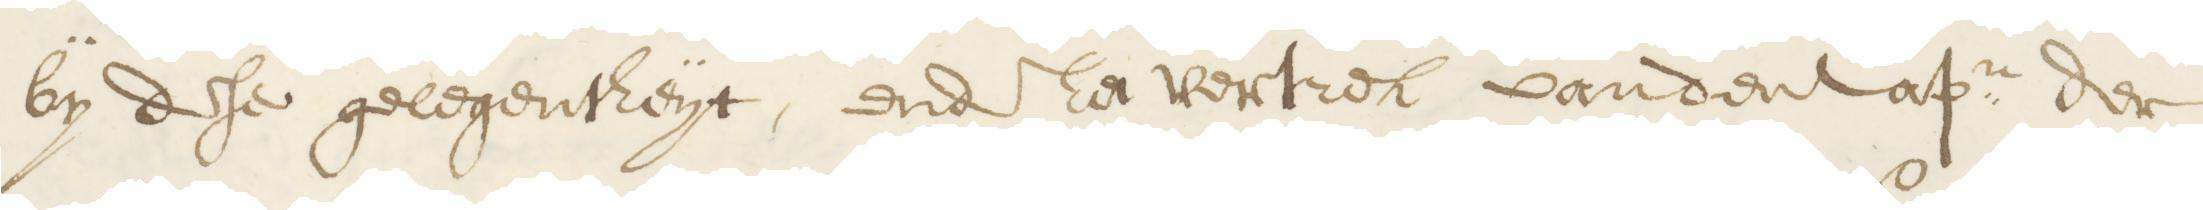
bij dese gelegentheijt, ende het vertrek vanden Cap:n der
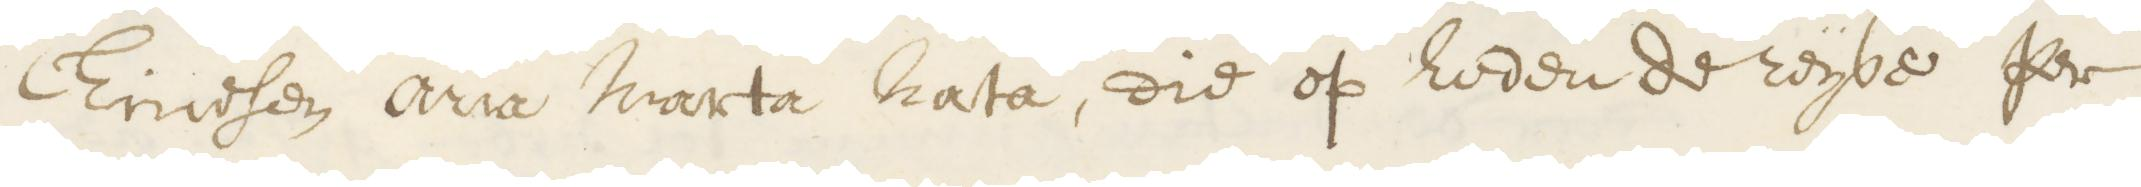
Chinesen aria marta nata, die op heden de reijse per
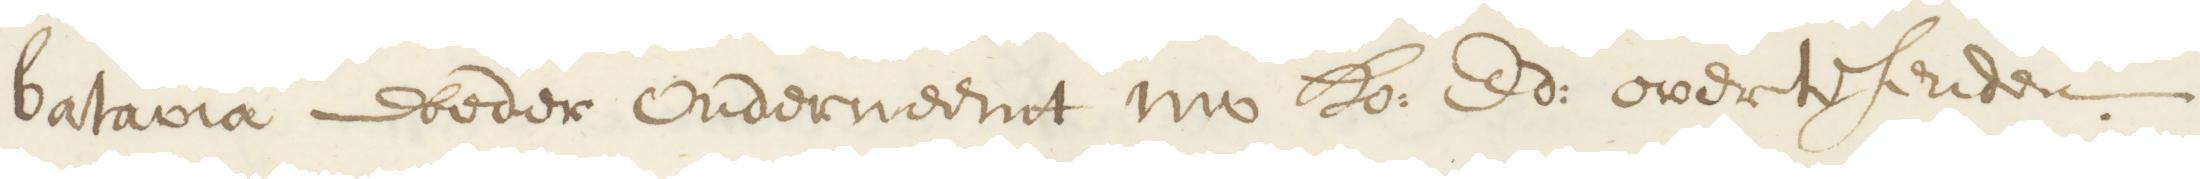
batavia weder onderneemt uw Ho: Ed: overtesenden
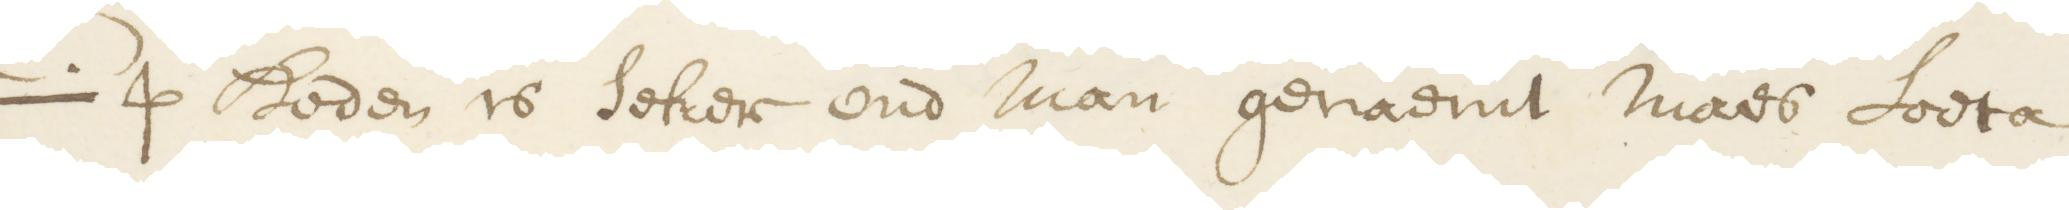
Op Heden is seker oud man genaemt maes soeta
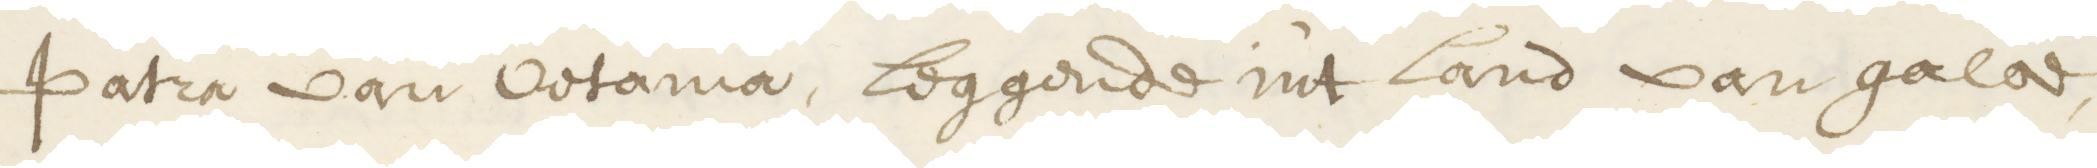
patra van oetama, leggende in't land van galoe,
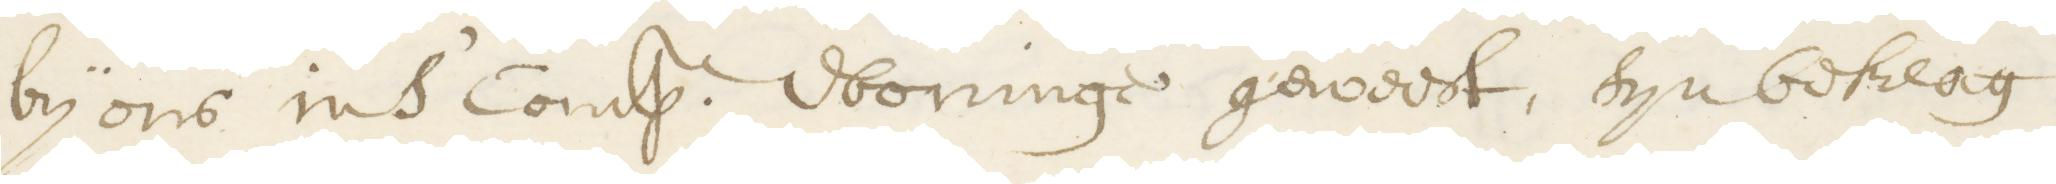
bij ons in s'Comp. woninge geweest, sijn beklag
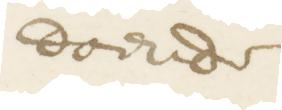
doende
